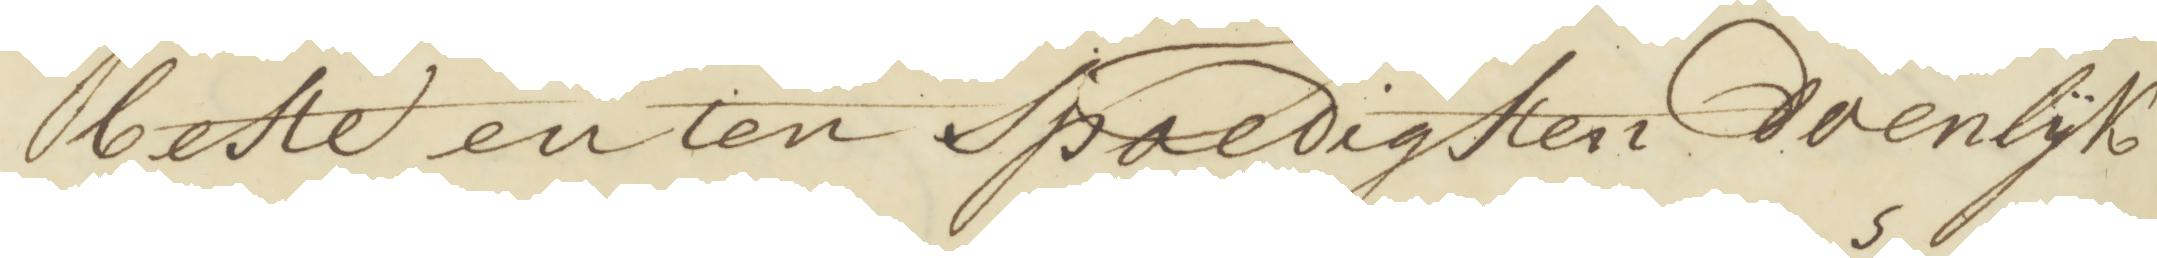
beste en ten spoedigsten doenlijk
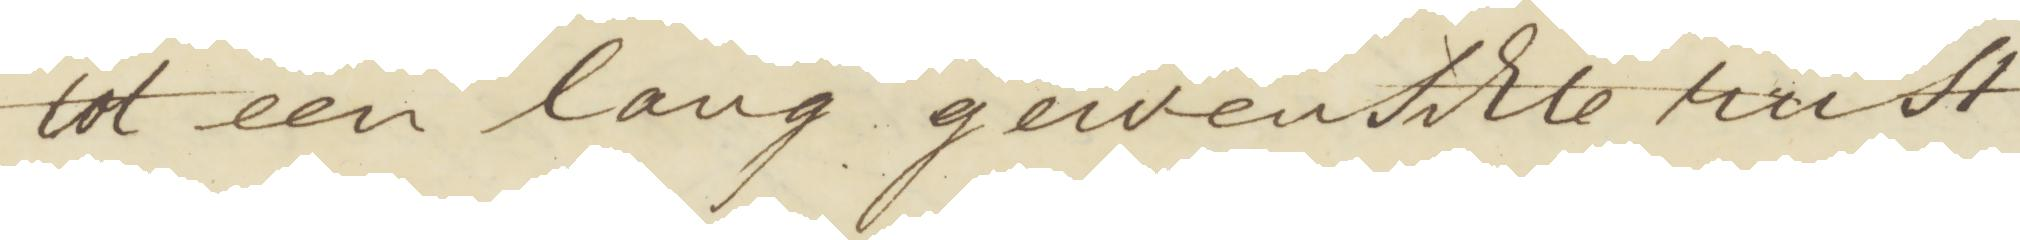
tot een lang gewenschte rust
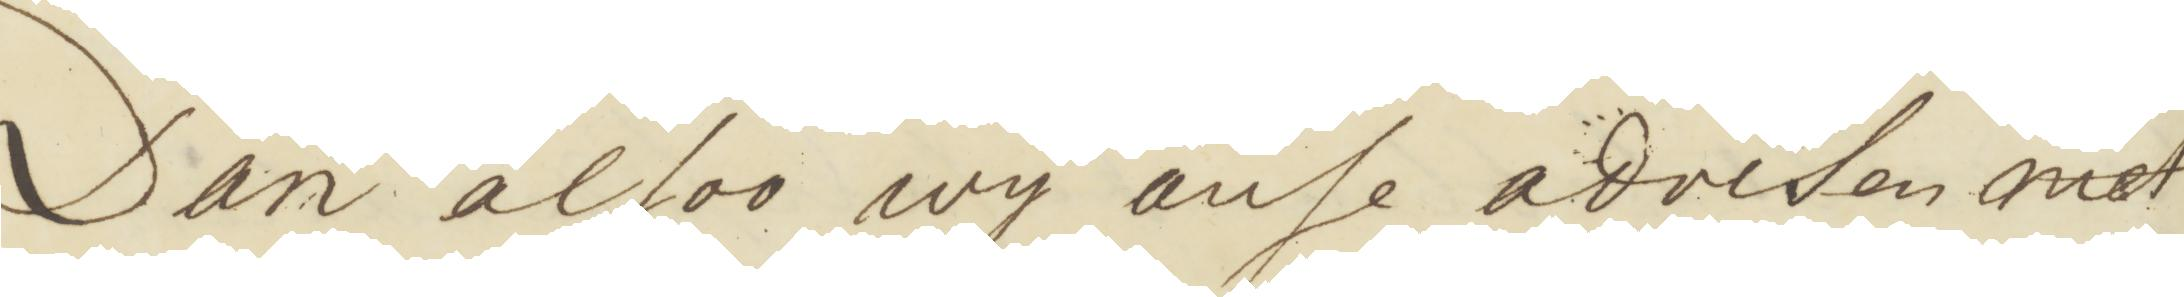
Dan alsoo wy onse advisen niet
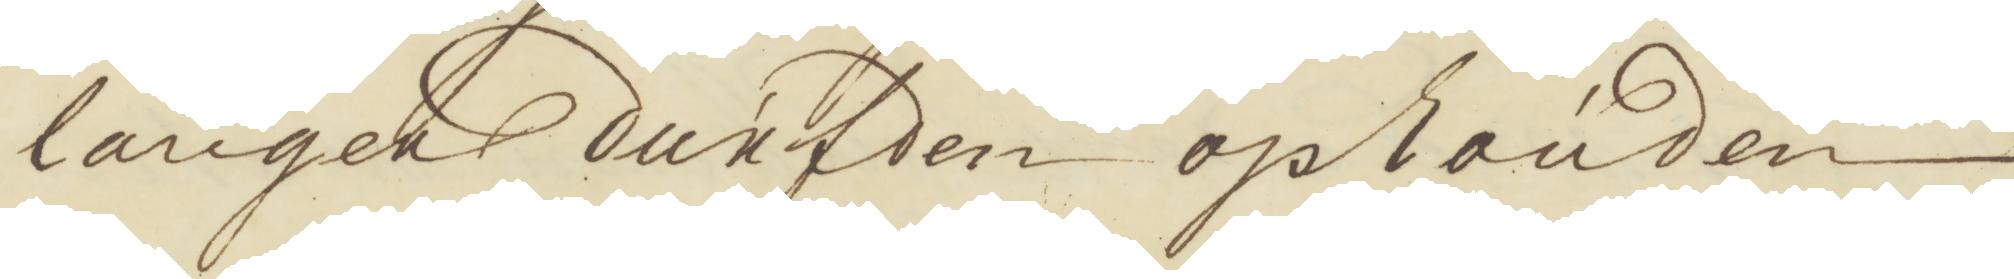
langer durfden ophouden
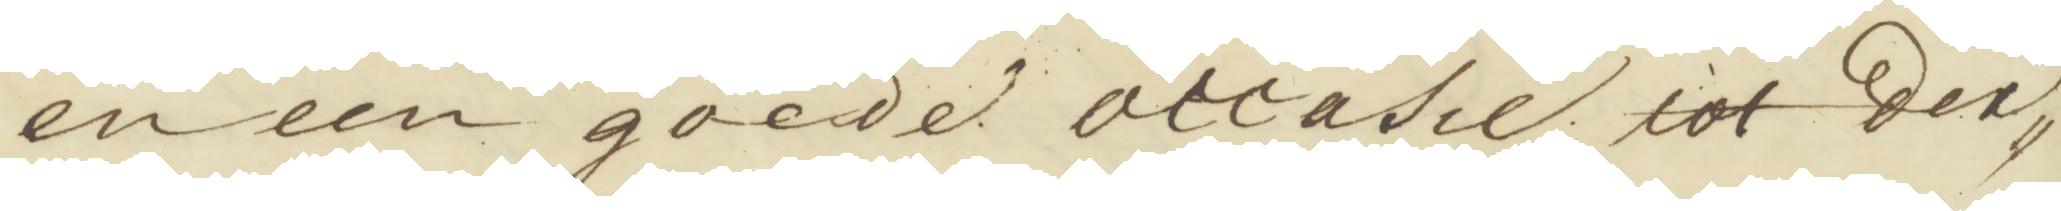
en een goede occasie tot der„
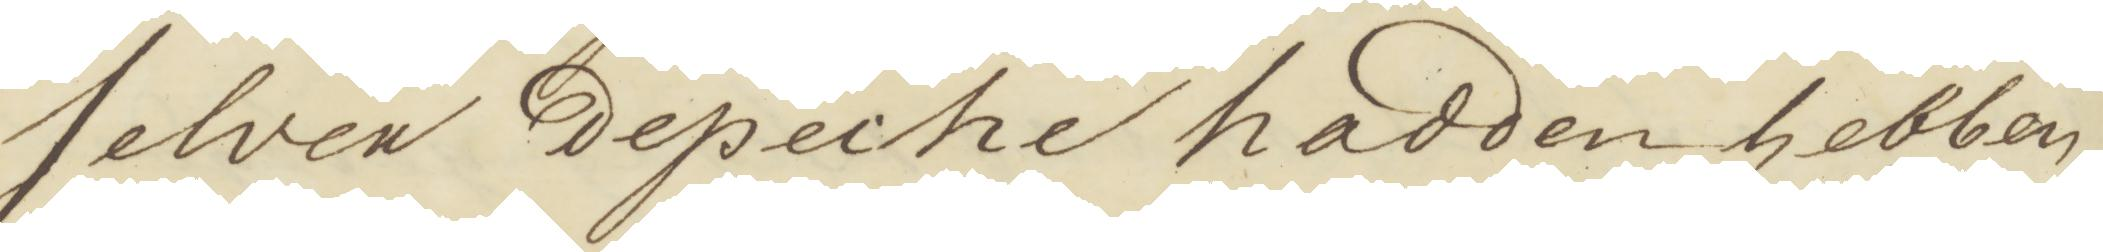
selver depeche hadden, hebben
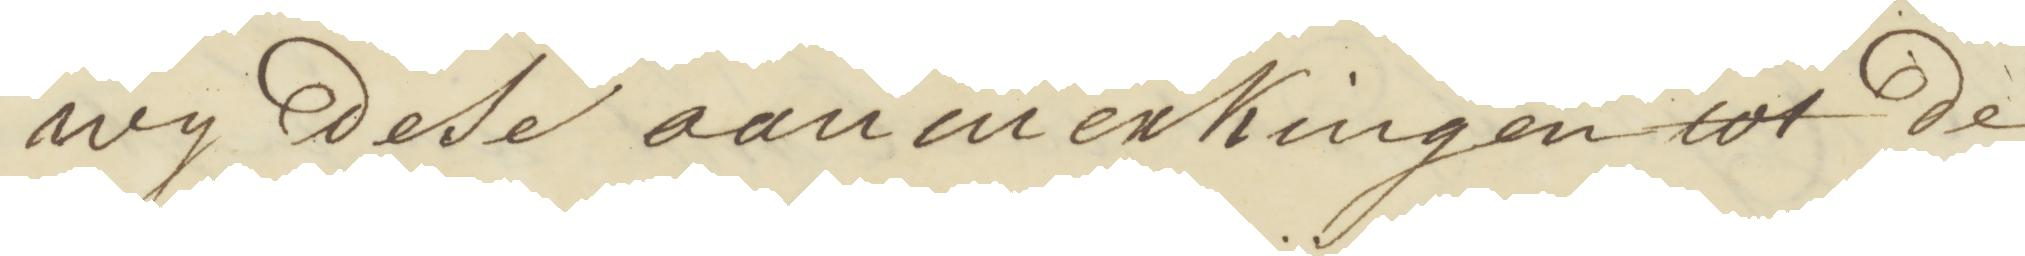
wij dese aanmerkingen tot de
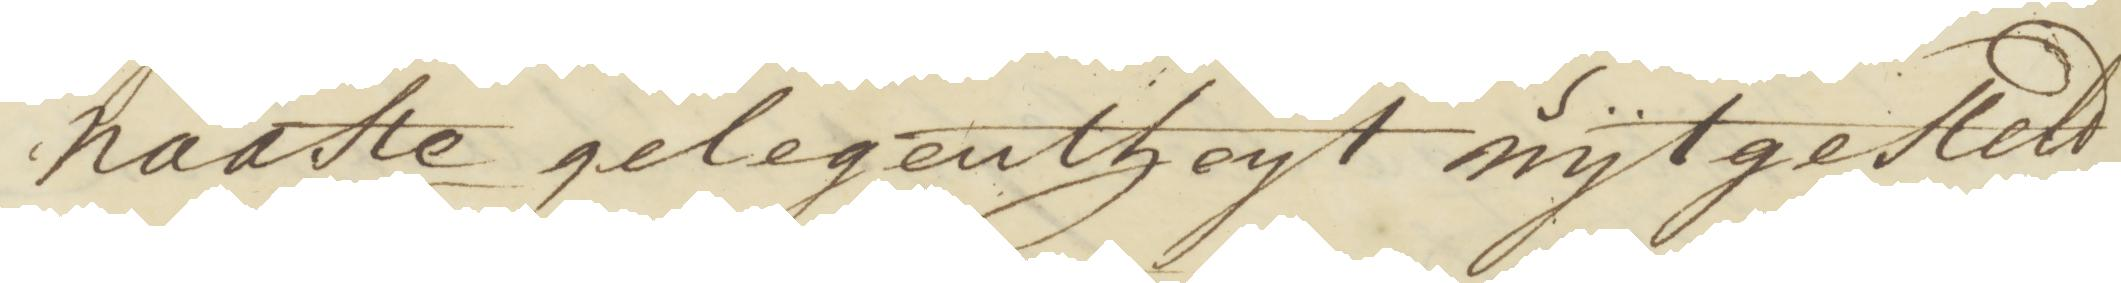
naaste gelegentheijt uijtgesteld
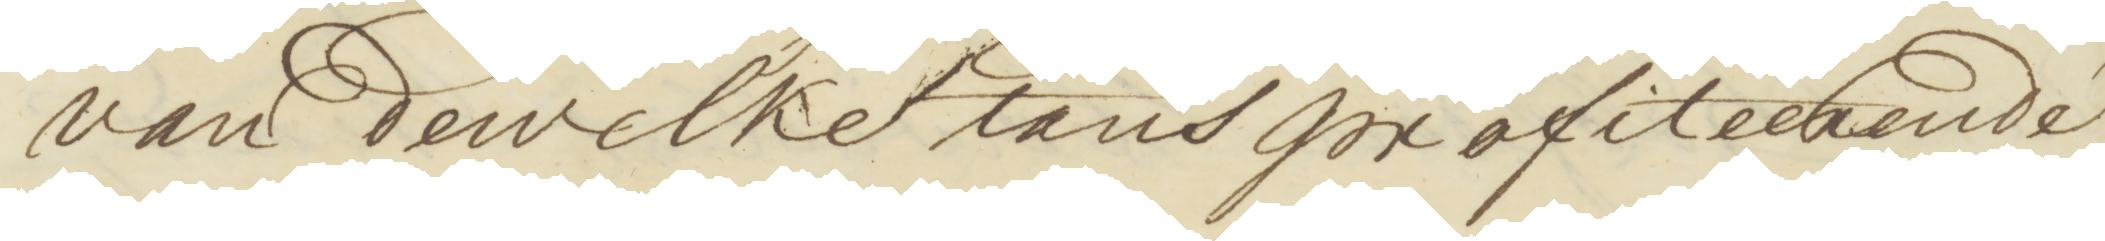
van dewelke tans profiteerende
